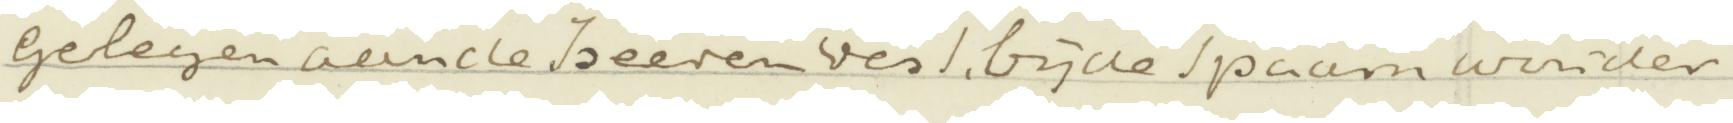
Gelegen aan de Heerenvest, bij de Spaarnwouder
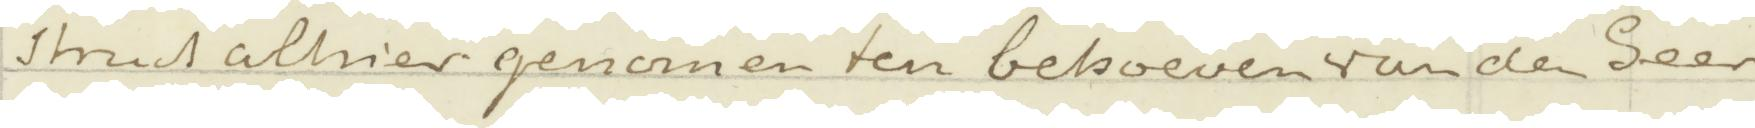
Straat alhier genomen ten behoeven van den heer
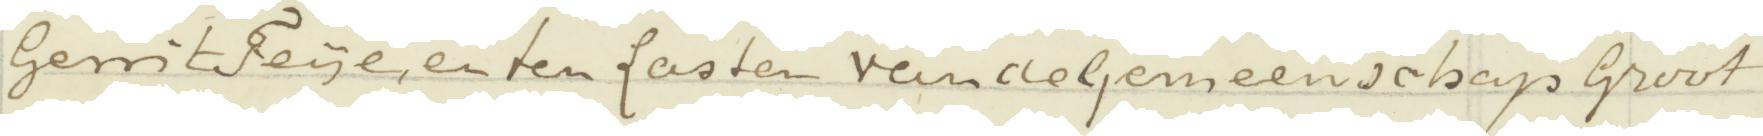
Gerrit Feije, en ten lasten van de Gemeenschap Groot
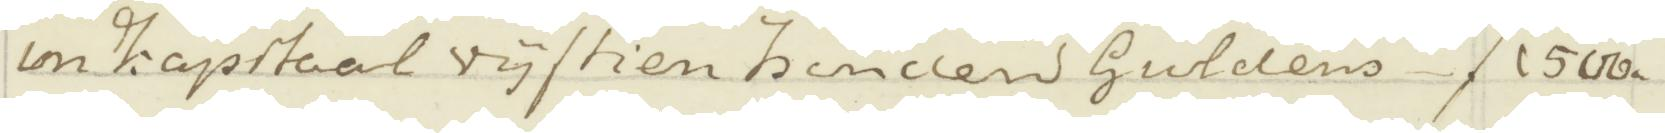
in kapitaal vijftien Honderd Guldens - ƒ 1500„ -
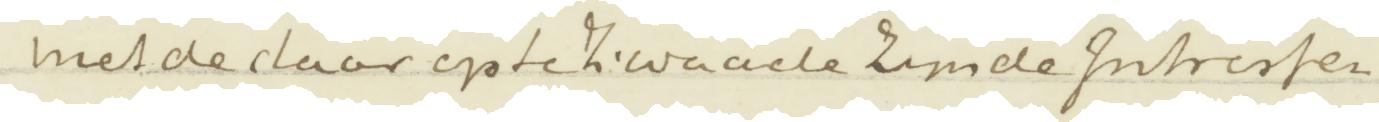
met de daar op te Kwaade Zyn de Jntressen
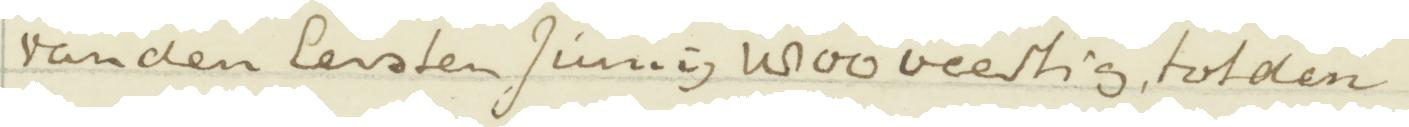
van den Eersten Junij 1800 veertig, tot den
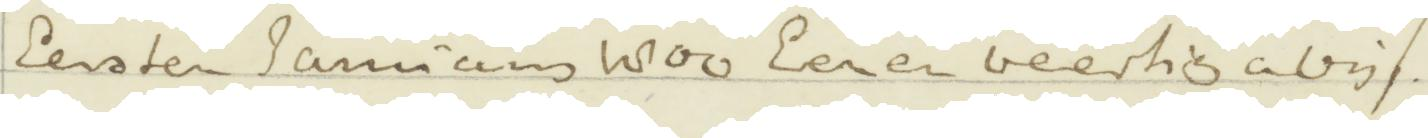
Eersten Ianuary 1800 Een en veertig a vijf
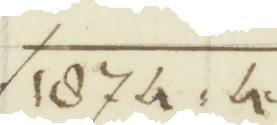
ƒ1874 „ 45 2/3
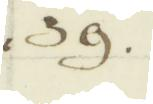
„ 39.
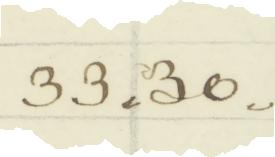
33 „ 30 „
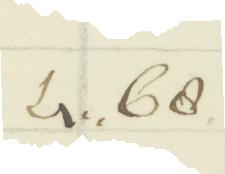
4 „ 68.
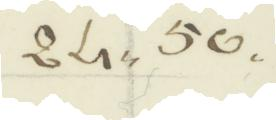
24 „ 50„
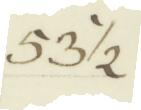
53½
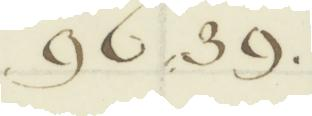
96 „ 39.
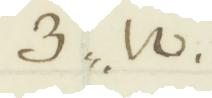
3 „ 10.
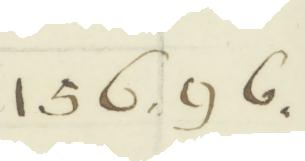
156 „ 96.
